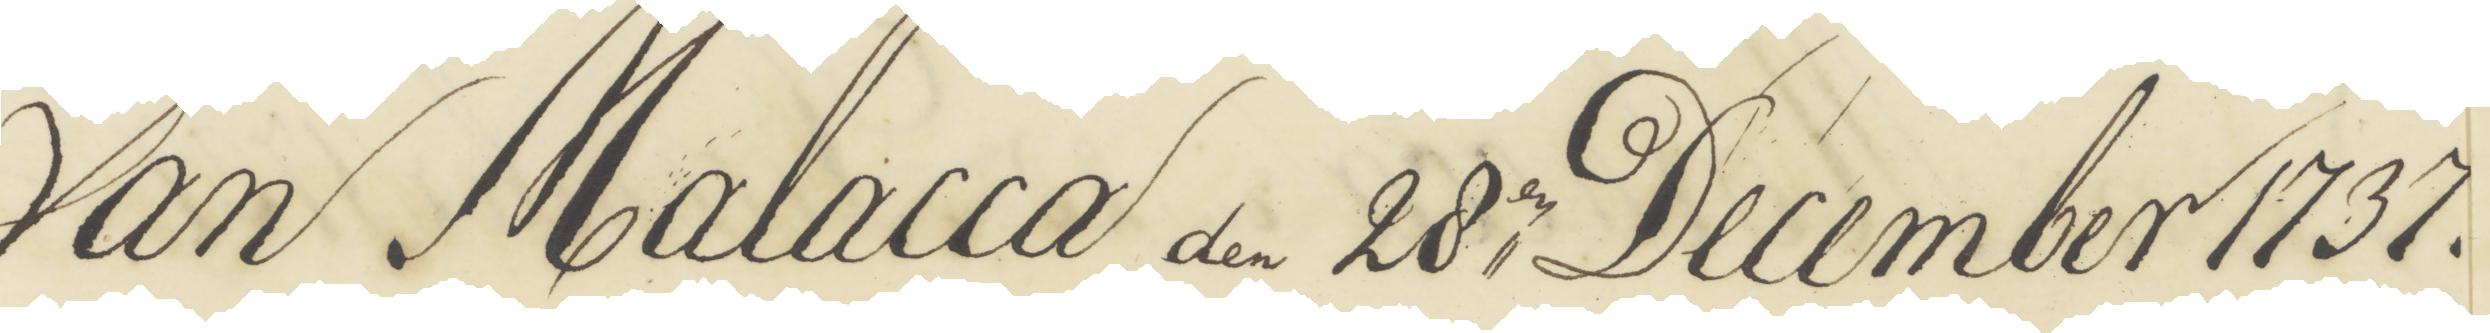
Van Malacca den 28„en December 1737.
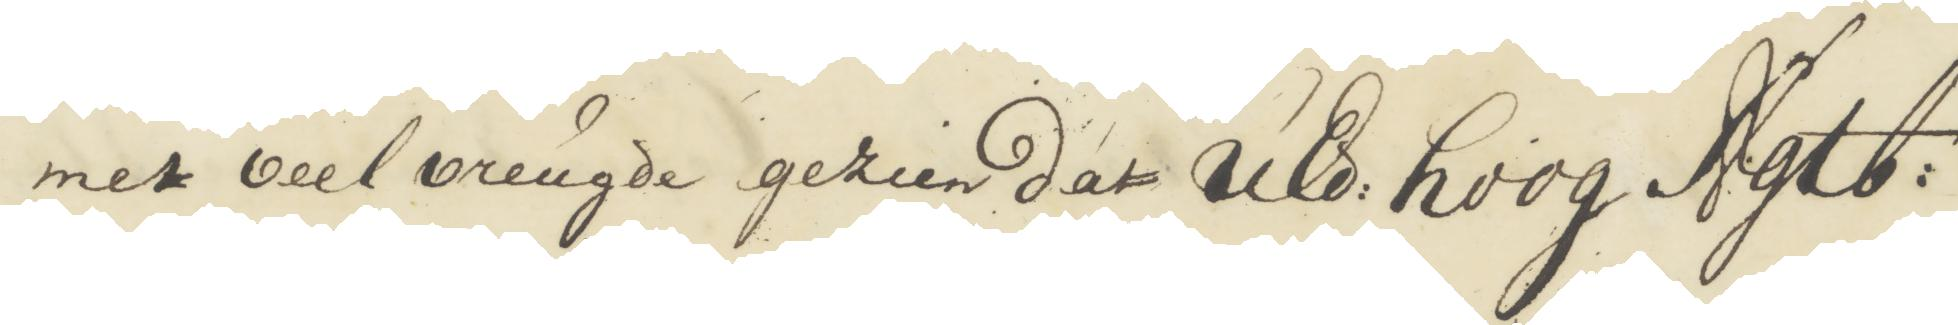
met veel vreugde gezien dat uEd: hoog Agtb:
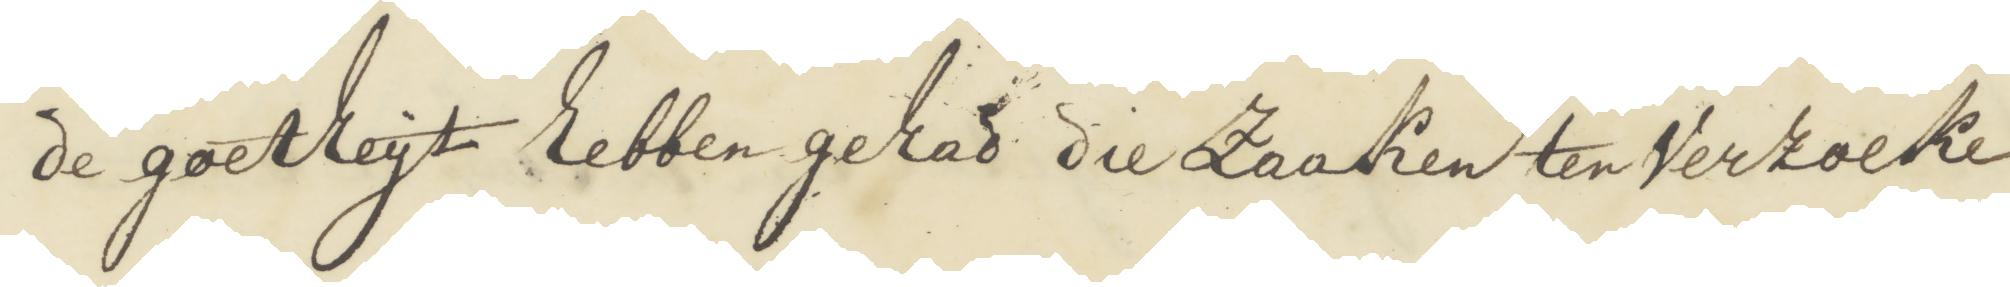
de goetheijt hebben gehad die zaaken ten verzoeke
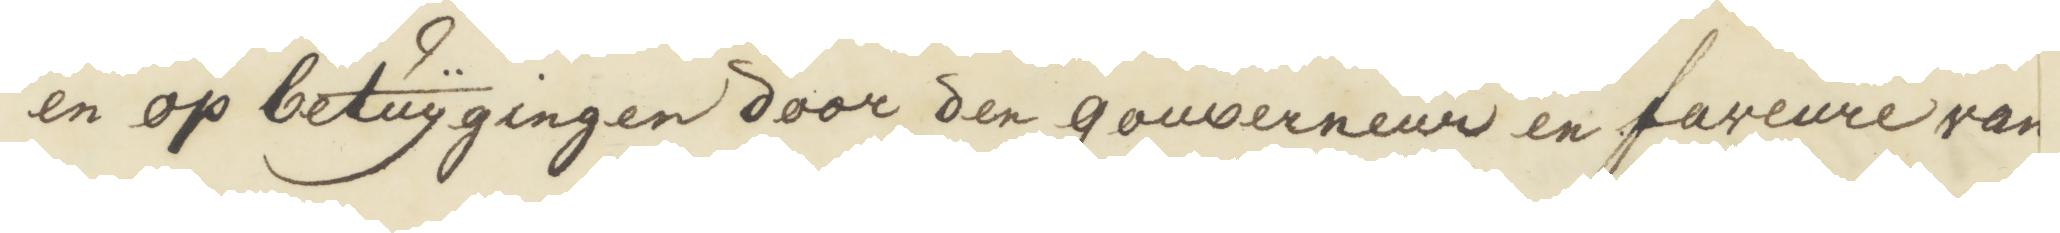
en op betuijgingen door der gouverneur en faveure van
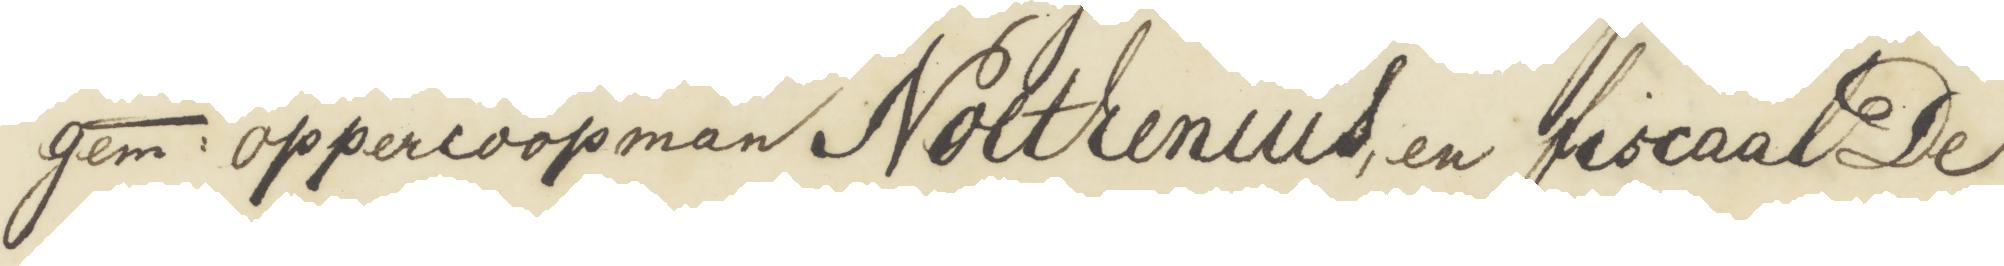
gem: oppercoopman Nolthenius, en fiscaal De
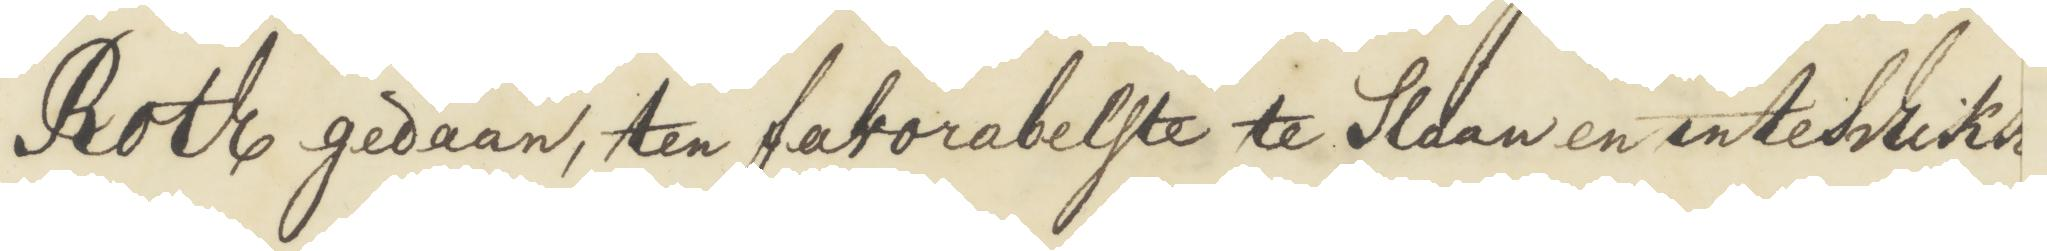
Roth gedaan, ten favorabelste te slaan en in te schik
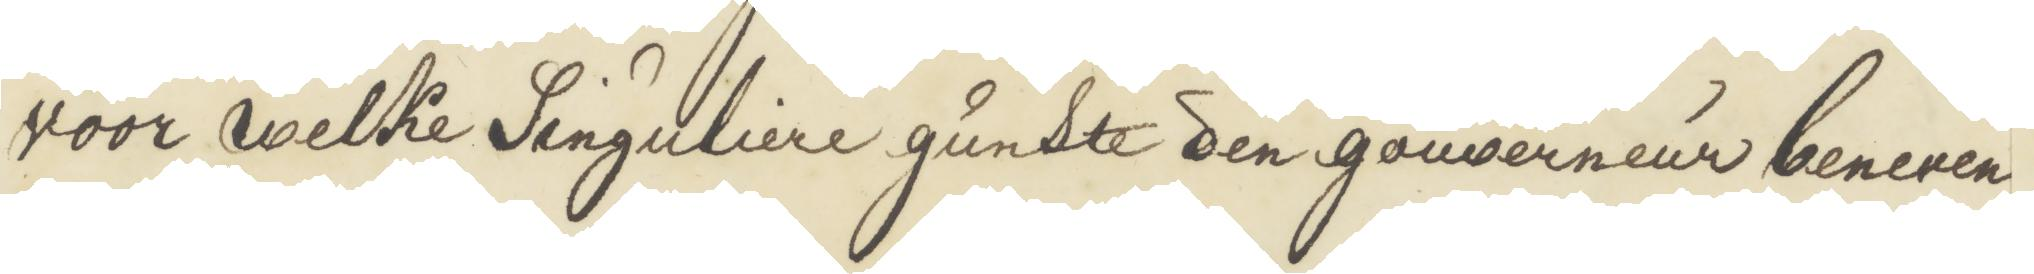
voor welke singuliere gunste den gouverneur beneven
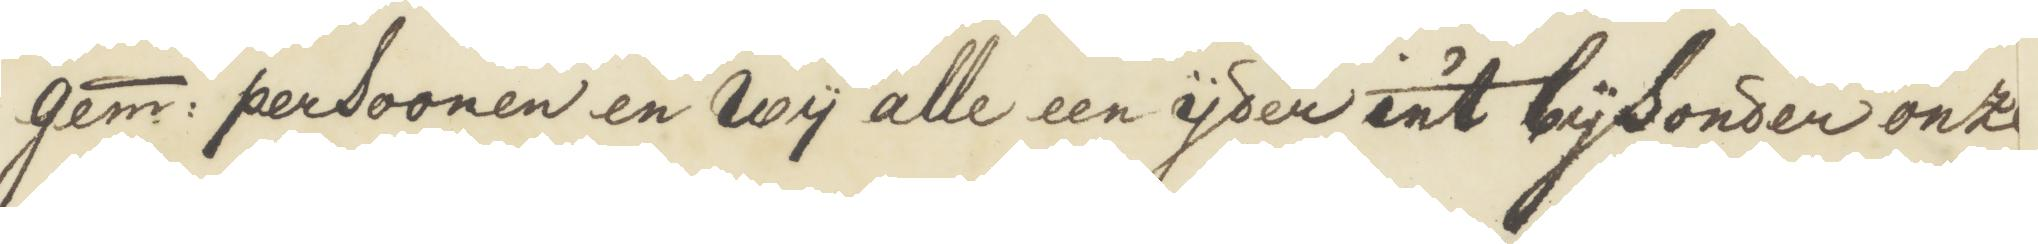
gem: persoonen en wij alle een ijder in't bijsonder onz
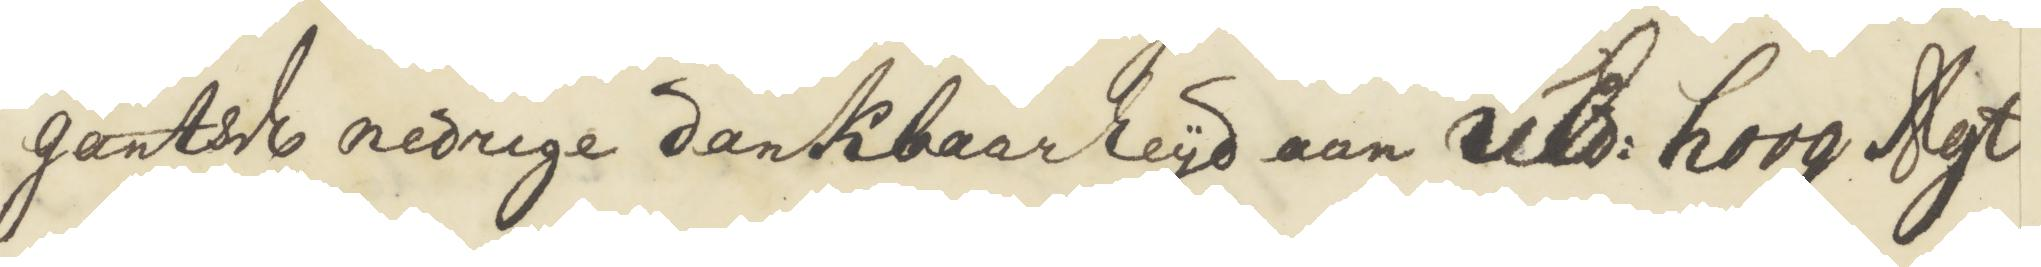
gantsch nedrige dankbaarheijd aan UEd: hoog Agt
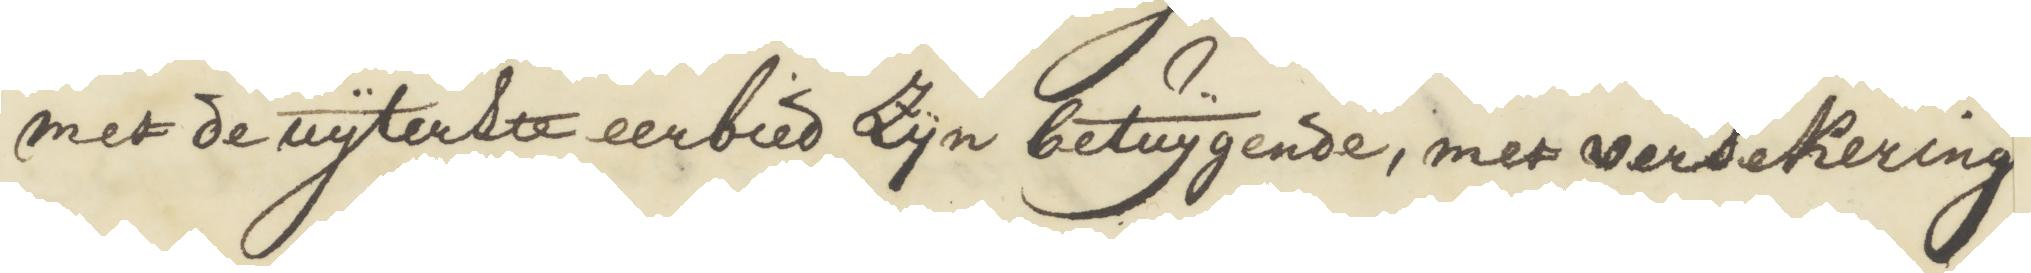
met de uijterste eerbied zijn betuijgende, met versekering
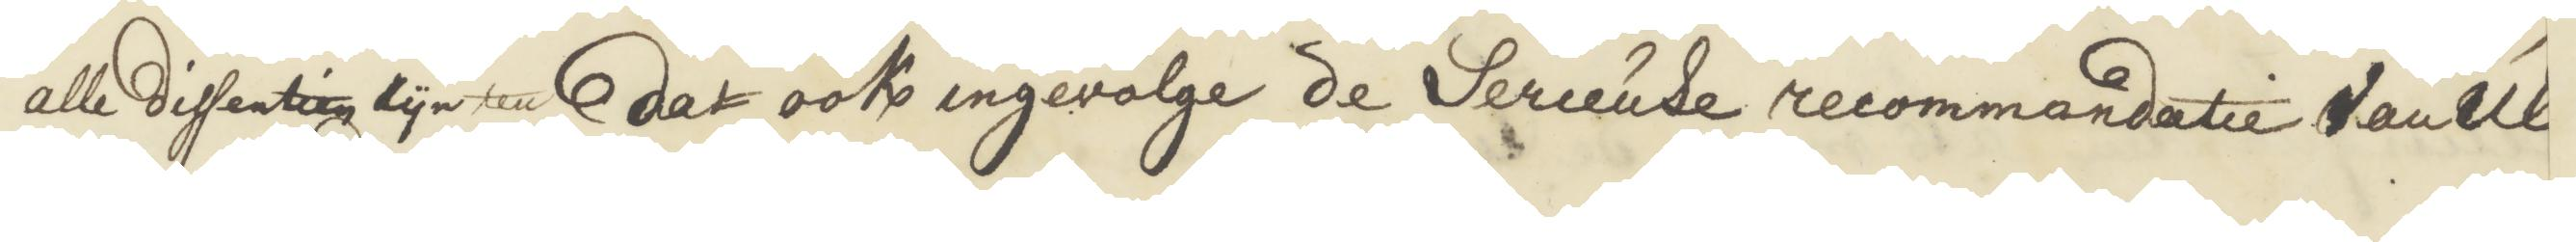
alle dissertien zijn ten dat ook ingevolge de serieuse recommandatie van UE
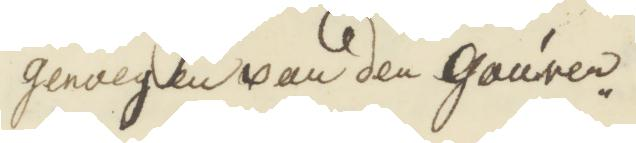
genoegen van den gouver„
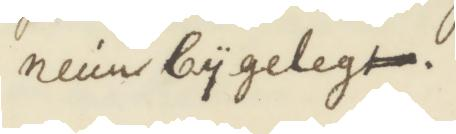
neur bij gelegt.
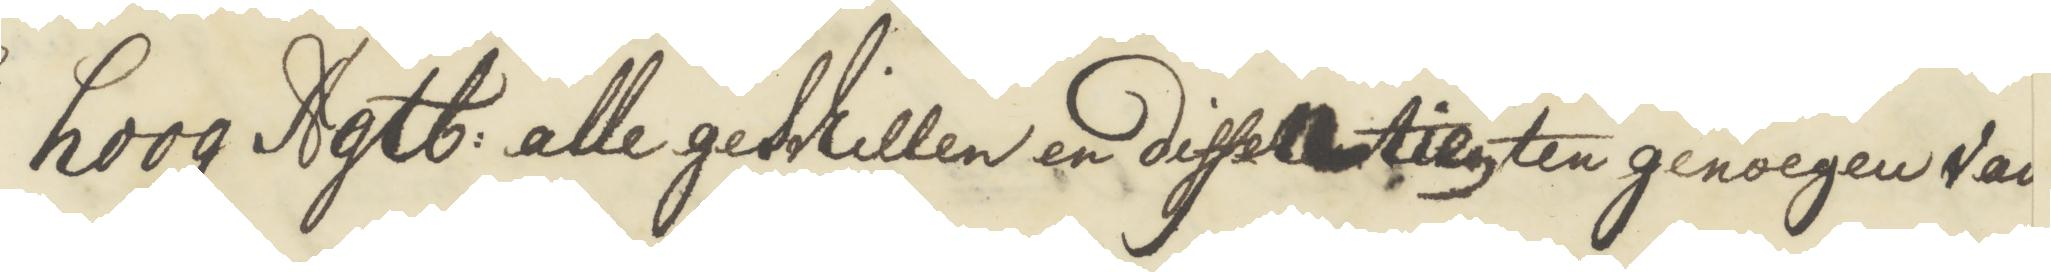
hoog Agtb: alle geschillen en dissertien ten genoegen va
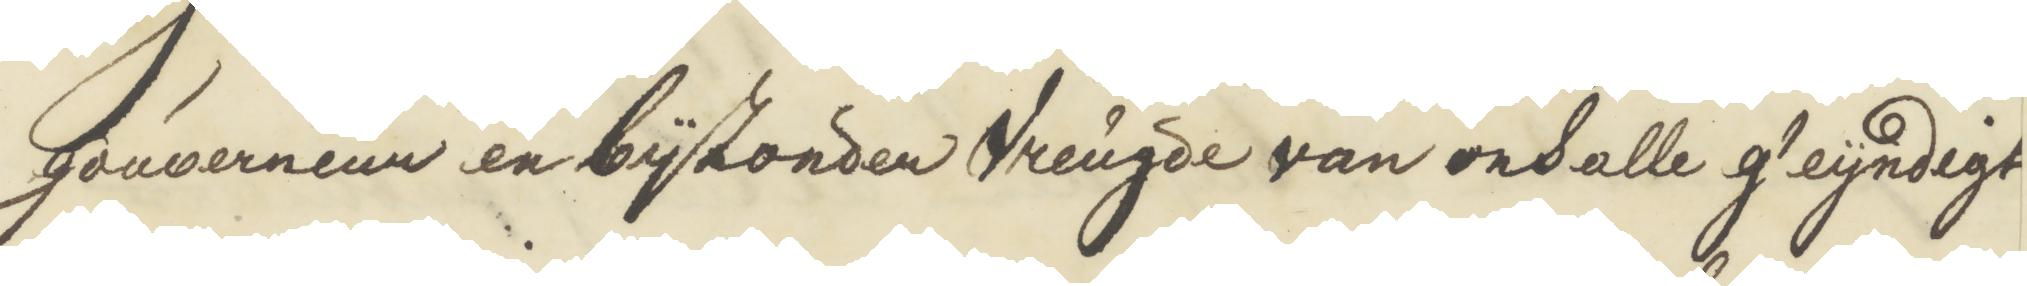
gouverneur en bijzonden vreugde van ons alle g’eijndigt
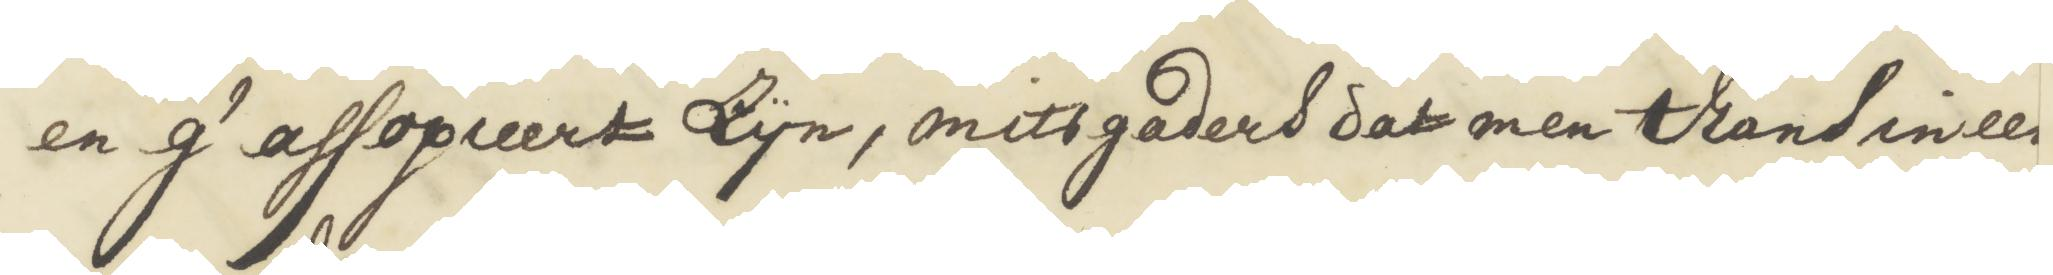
en g’assopieert zijn, mitsgaders dat men thans in ee
